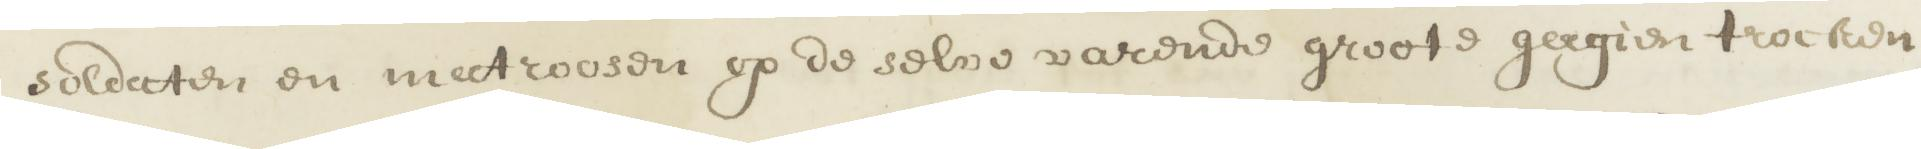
soldaten en matroosen op de selve varende groote gagien trocken
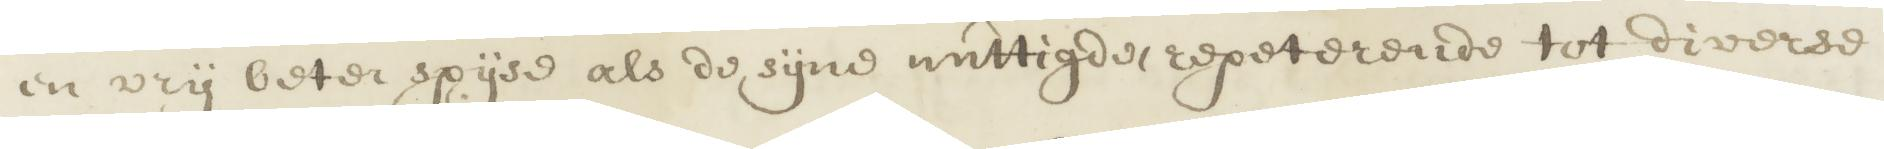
en vrij beter spijse als de sijne nuttigde, repeterende tot diverse
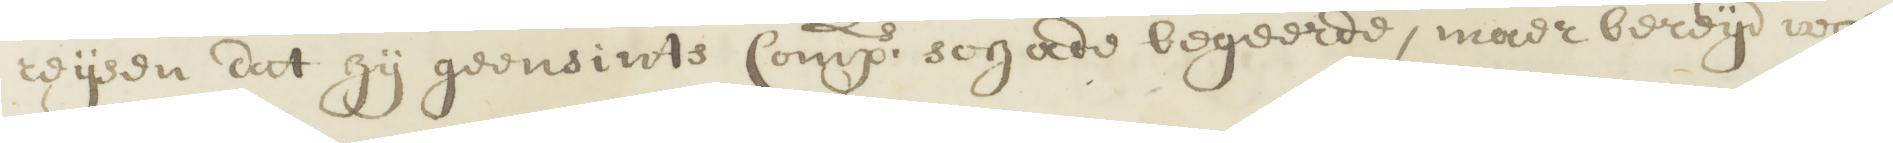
reijsen dat zij geensints Comp:s schade begeerde, maer bereijd was
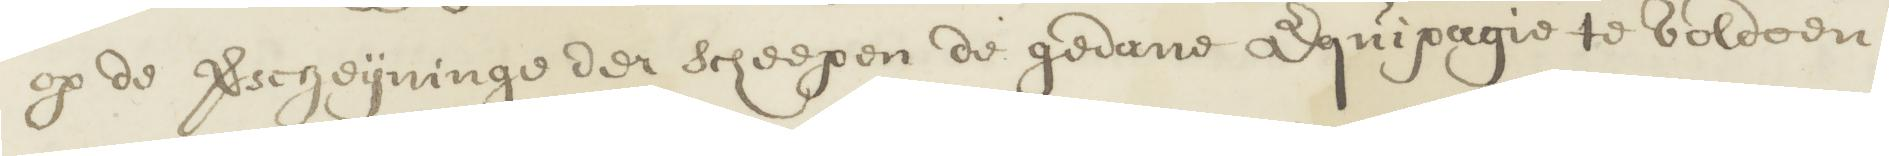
op de verscheijninge der scheepen de gedane Equipagie te voldoen
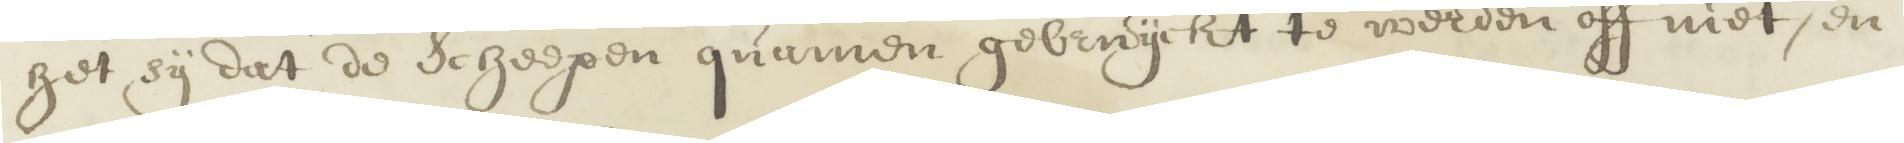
het zij dat de scheepen quamen gebruijckt te werden off niet, en
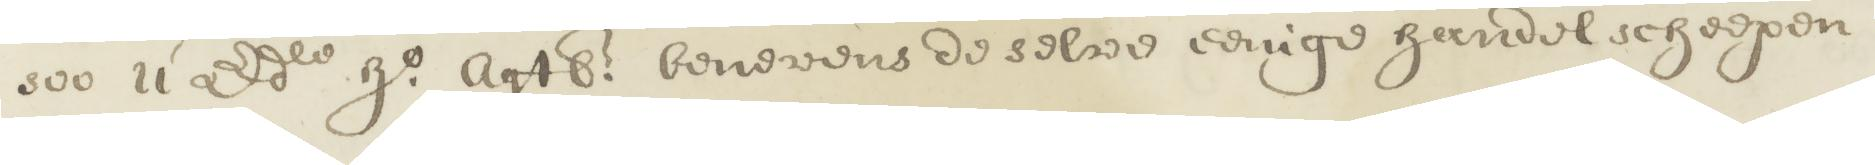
soo u Edle h.o Agtb. benevens de selve eenige handel scheepen
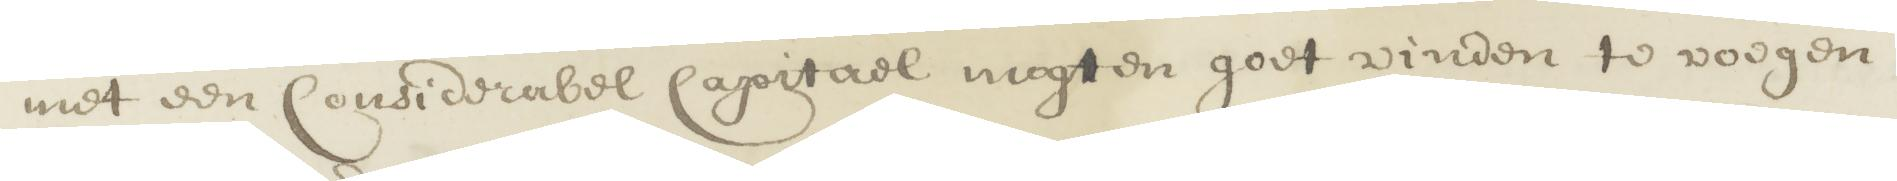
met een Considerabel Capitael mogten goet vinden te voegen
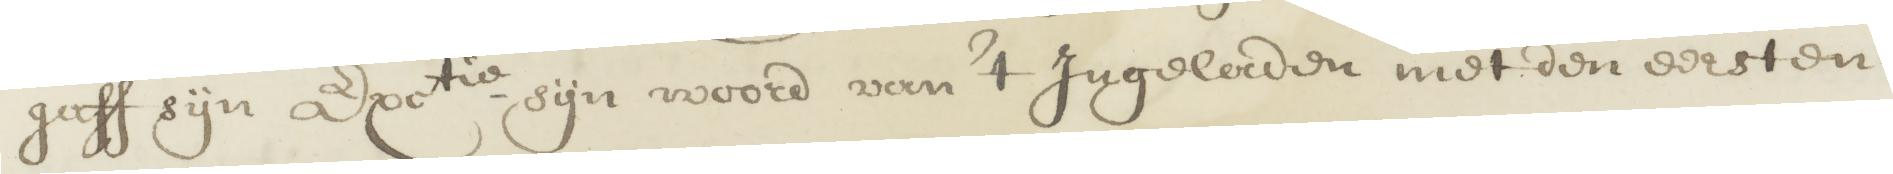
gaff sijn Exc-tie sijn woord van ’t Jngeladen met den eersten
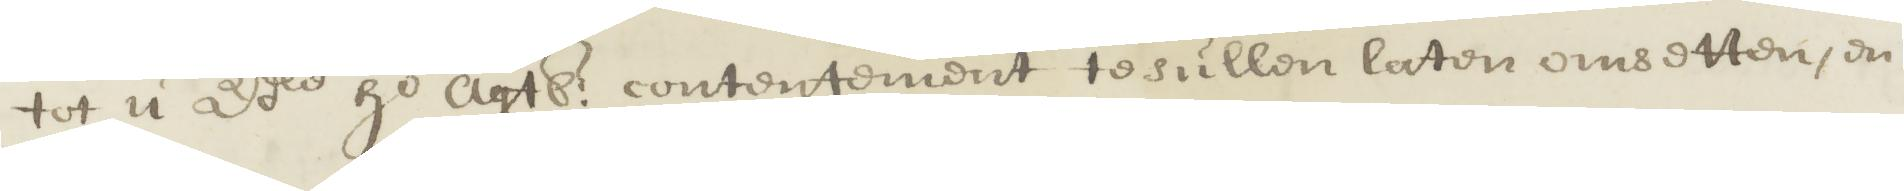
tot u Edle ho Agtb: contentement te sullen laten omsetten, en
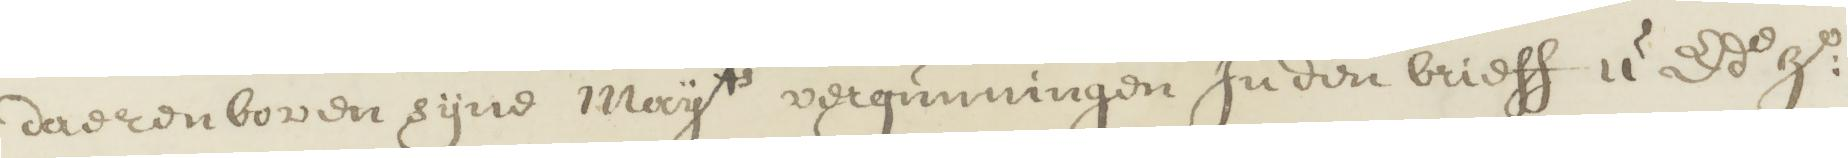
daerenboven sijne Maijts vergunningen Jn den brieff u Edle h:o
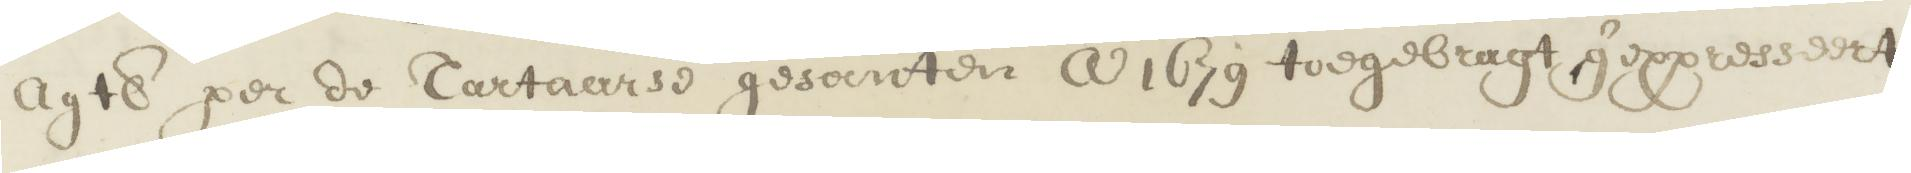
agtb per de Cartaarse gesanten Ao 1679 toegebragt g'expresseert
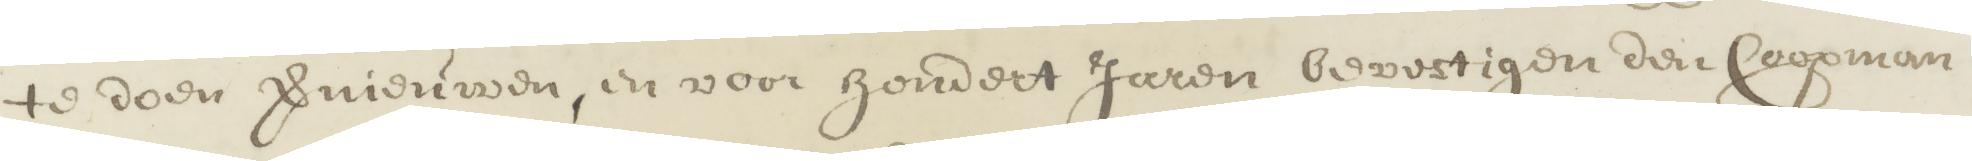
te doen vernieuwen, en voor hondert Jaren bevestigen den Coopman
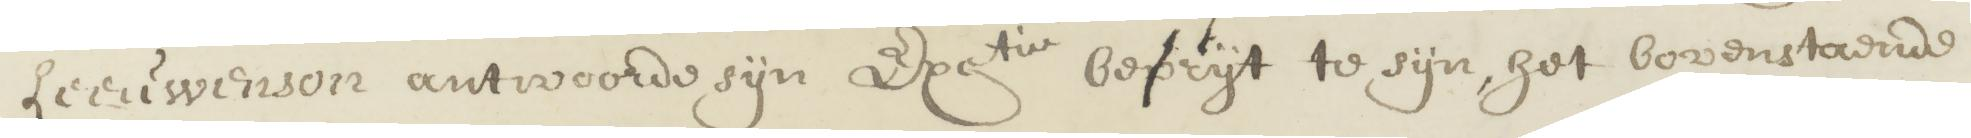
Leeuwenson antwoorde sijn Exctie bevrijt te sijn, het bovenstaende
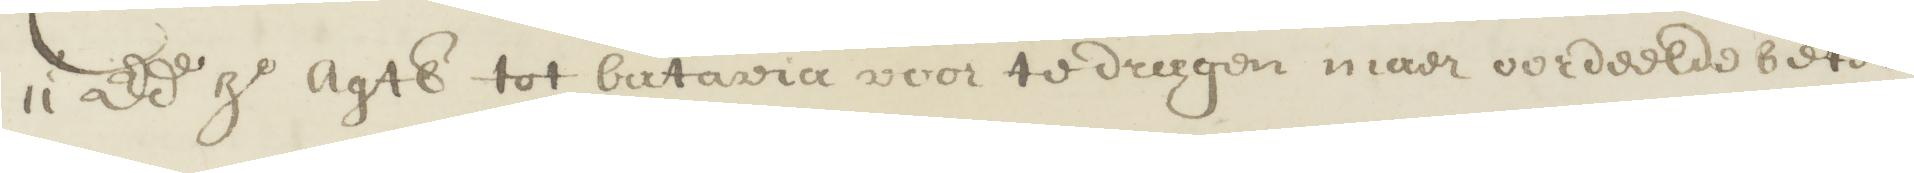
u Ede ho Agtb tot batavia voor te dragen maer oordeelde beter
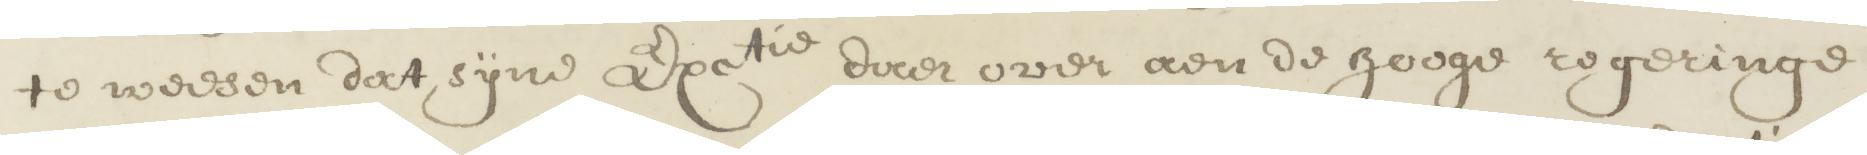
te weesen dat sijne Exctie daer over aen de hooge regeringe
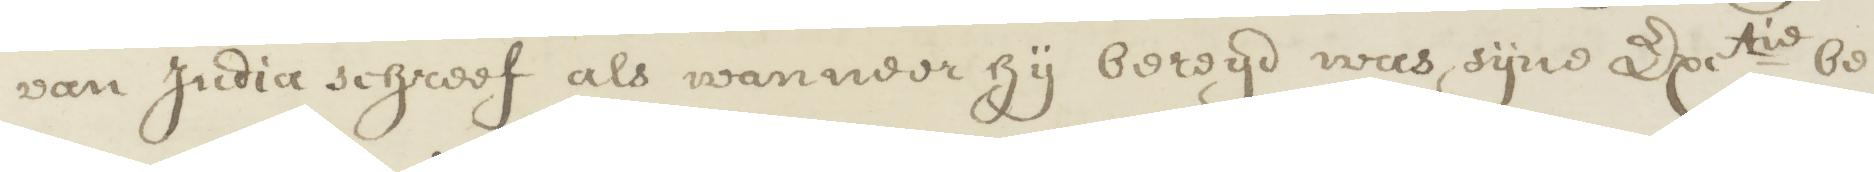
van Jndia schreef als wanneer hij bereijd was sijne Exe=tie be
